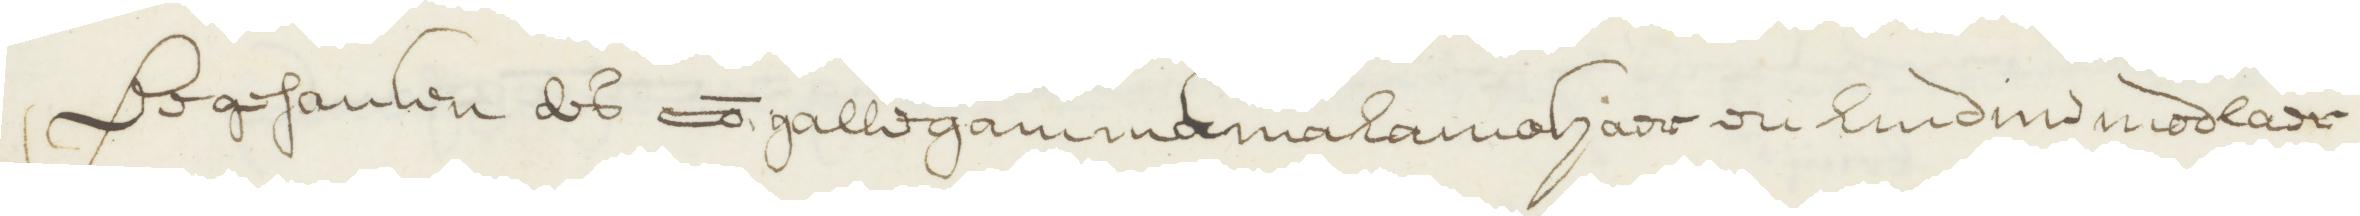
Ee gesanten des co: gallegammamahamotjaer en hindine modlaer
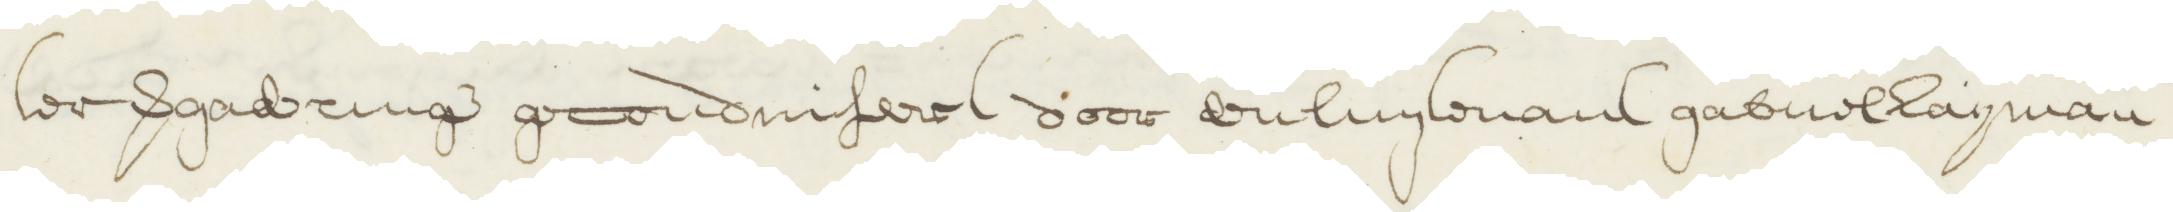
ter vergaderinge geconduisert door den luytenant gabriel haijman
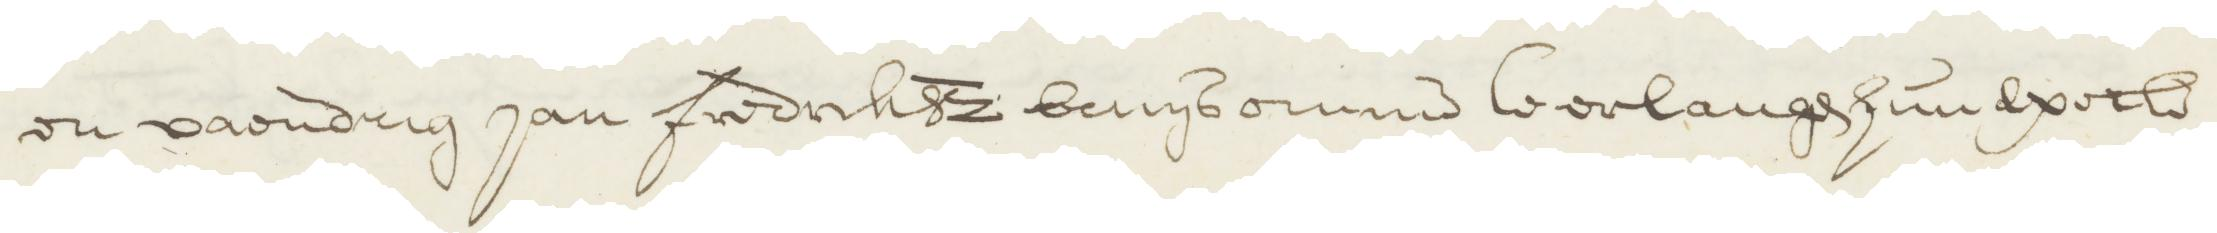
en vaendrig jan fredriksz benys omme te erlangen hun deporte
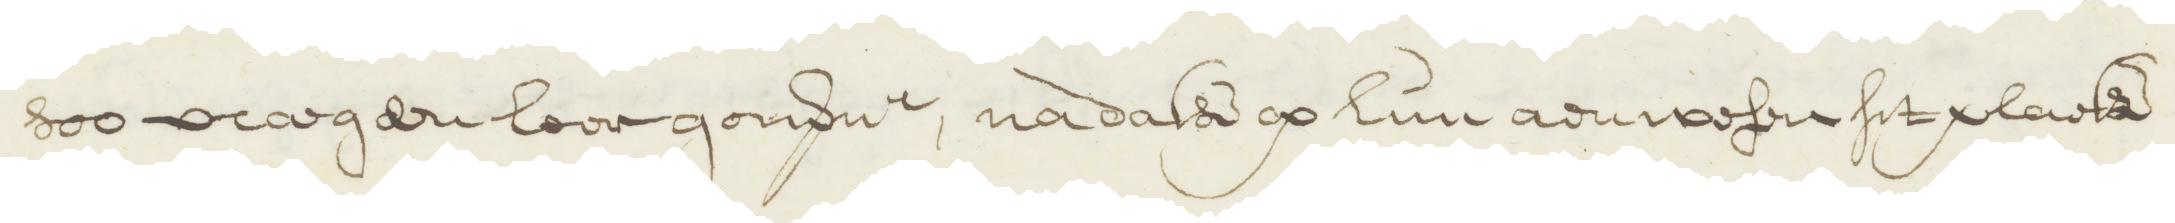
soo vroeg den heer gouvernr, na datse op hun aenwesen sit plaetse
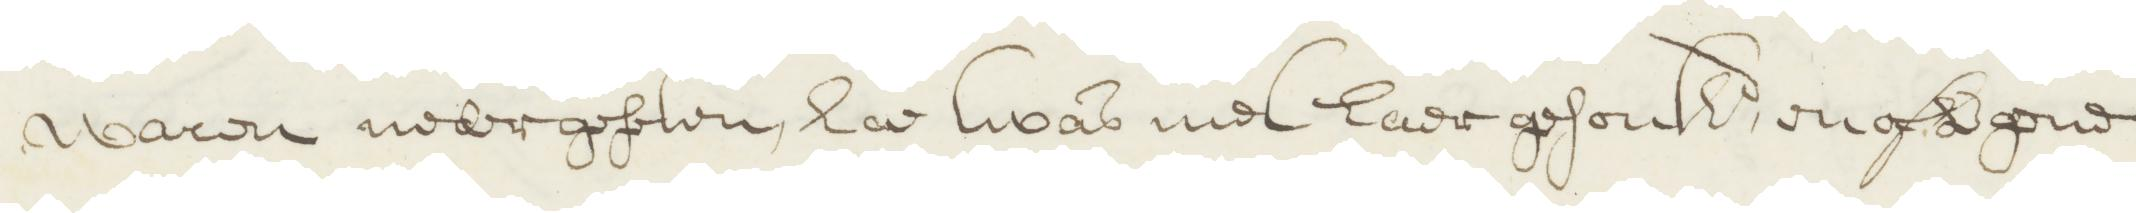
waren nedergeseten, hoe twas met haer gesonth„d en of de gene
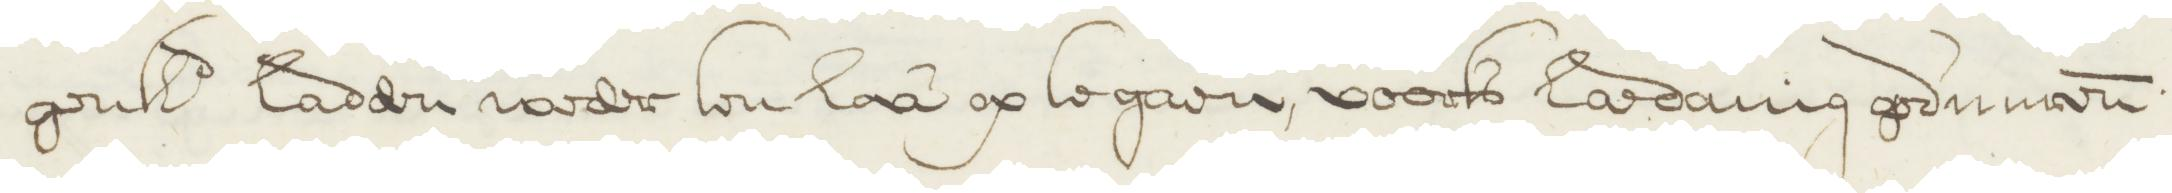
genth=d hadden weder ten have op te gaen, voorts hoedanig geduuren
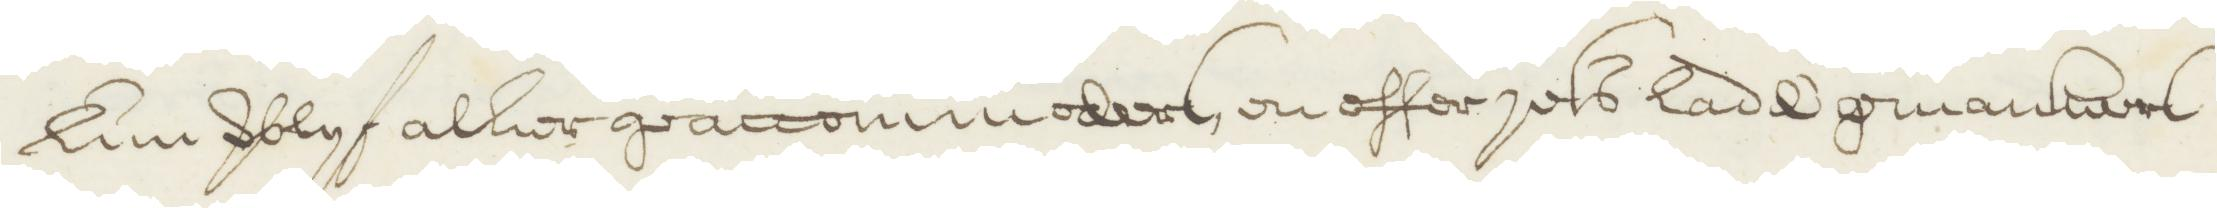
hun verblyf alhier geaccommedeert, en offer jets hadde gemankeert
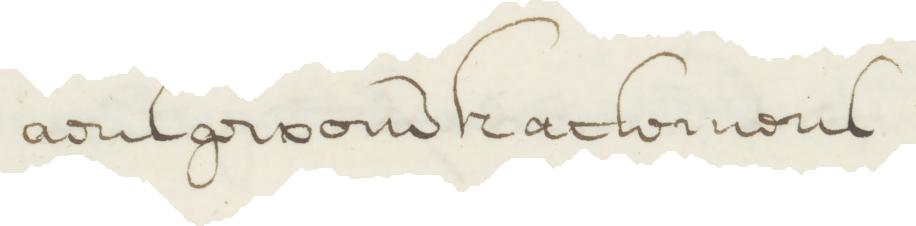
aent gewone tractement
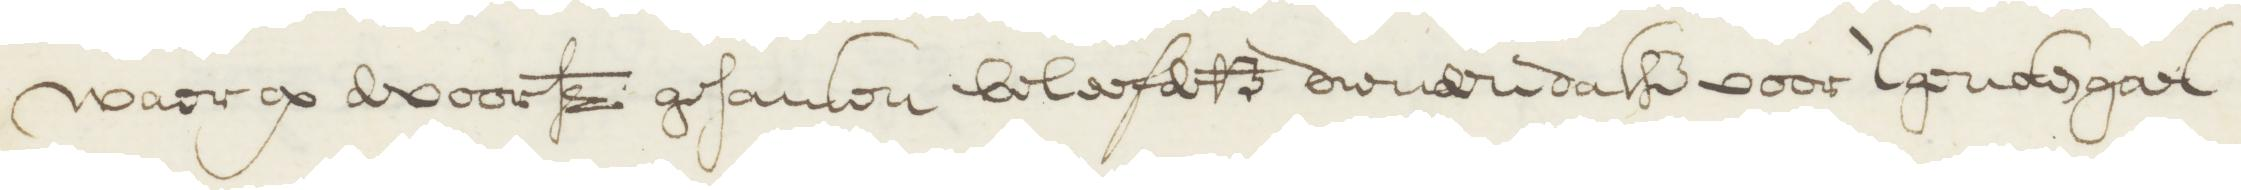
waer op devoorsz: gesanten beleefdelijk dienden datse voor ’t genoten goet
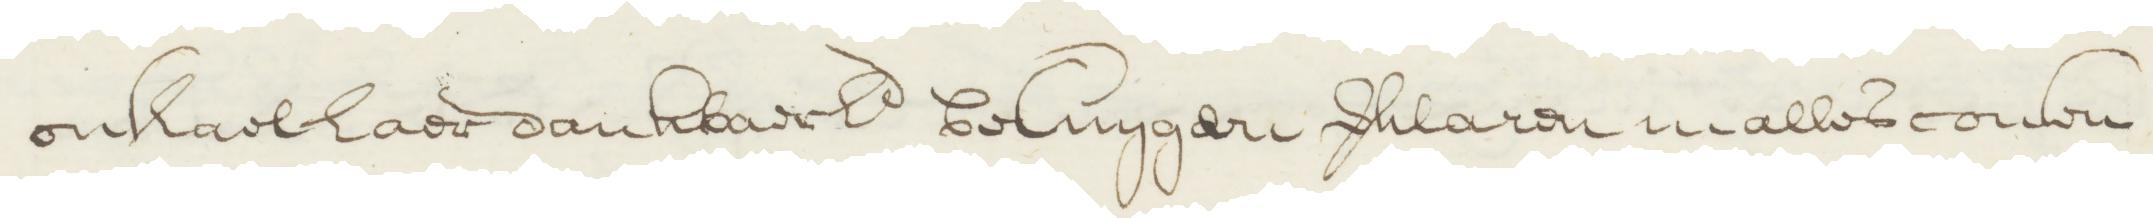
onthael haer dankbaerhd betuijgden verklaren in alles conten
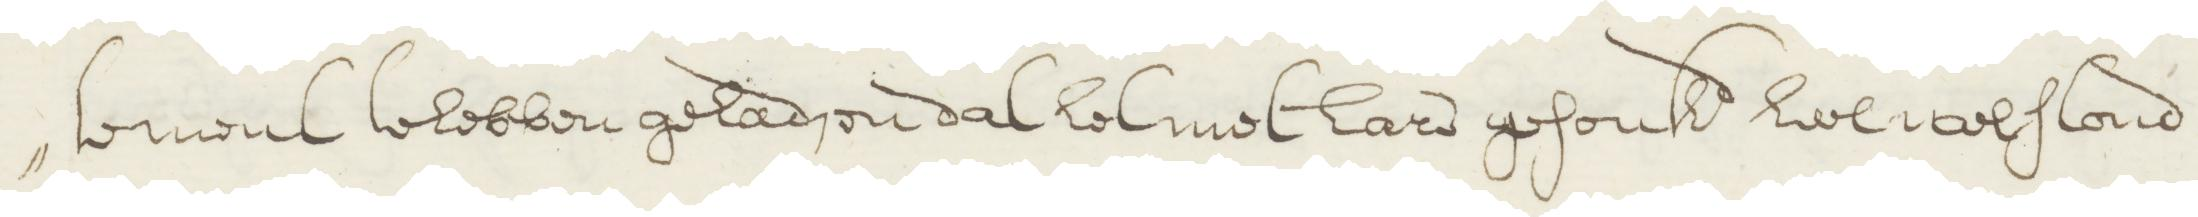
„tement te hebben gehad, en dat het met hare gesonthd heel wel stond
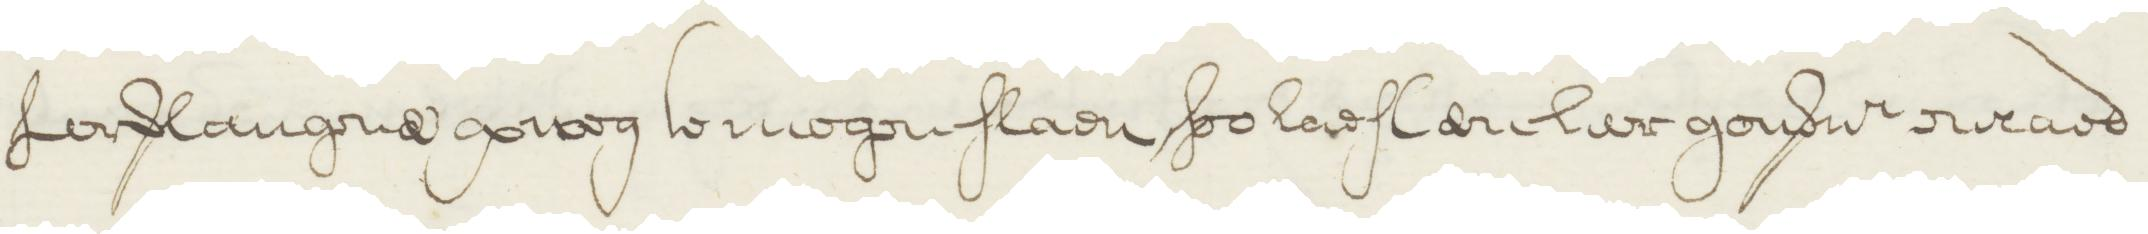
seer verlangende op weg te mogen slaen, so hoeft den heer gouverr en raed
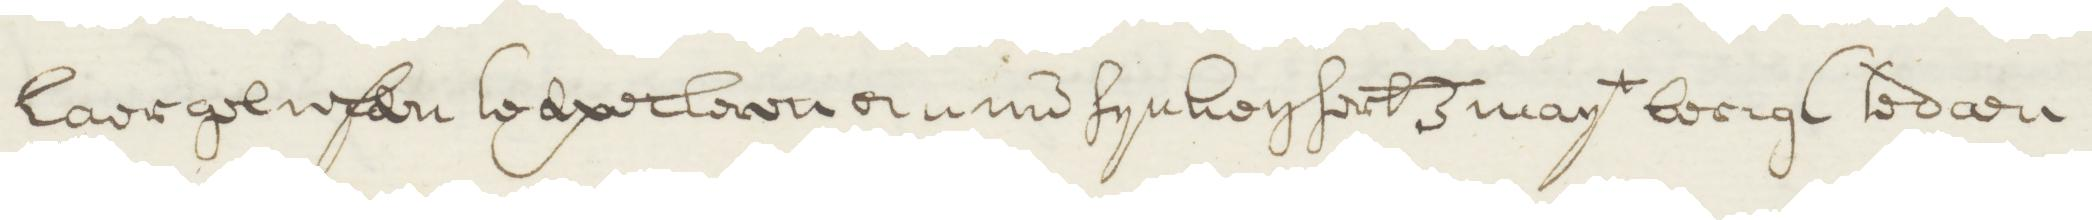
haer geliefden te depecheren om ine syn keyserlijk mayt berigt tedoen
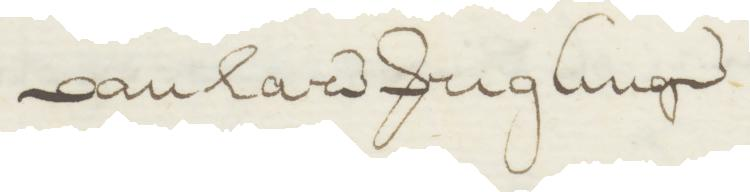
van hare verrigtinge
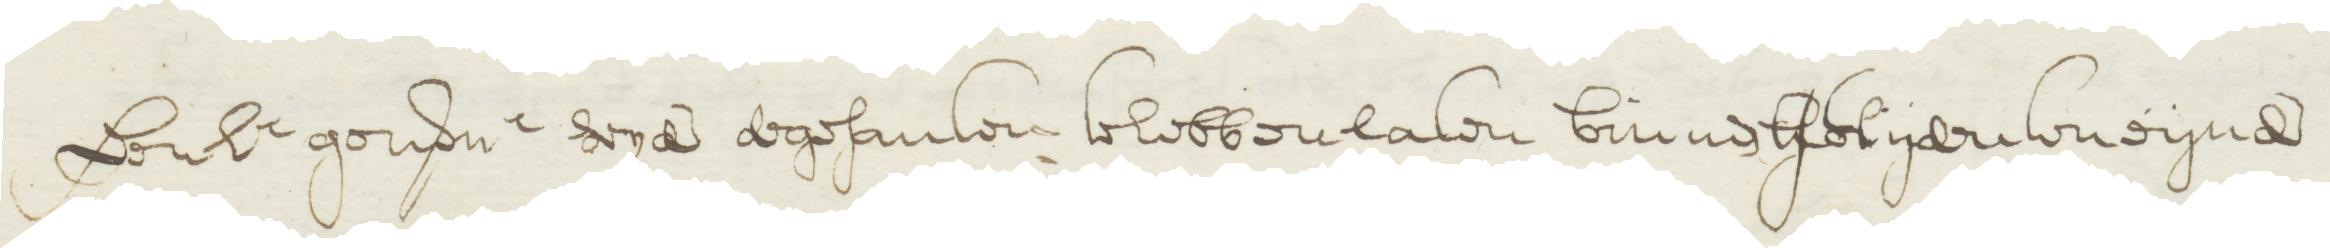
Den h:r gouvern:r seijde degesanten te hebben laten binnen gelijden ten eijnde
